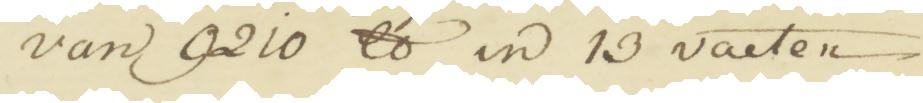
van 9210 lb in 13 vaeten
